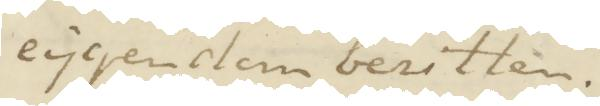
eijgendom bezitten.
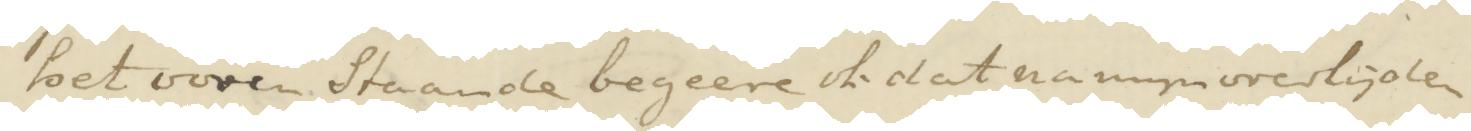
het boven staande begeere ik dat na myn overlijden
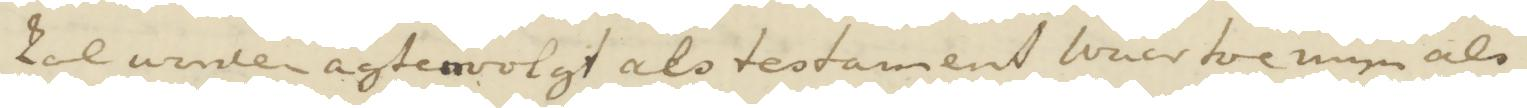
zal worden agtervolgt als testament waar toe myn als
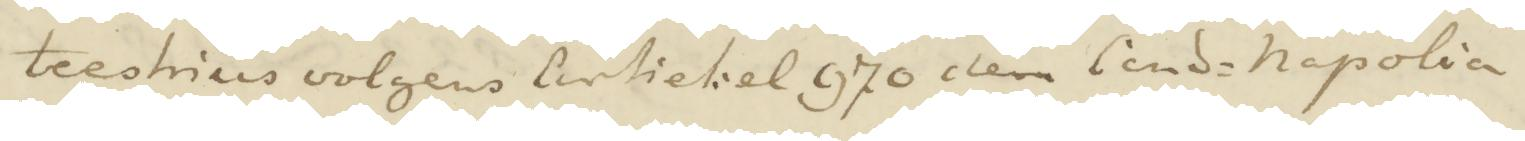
teestrius volgens Artiekel 970 den Cod= Napolia
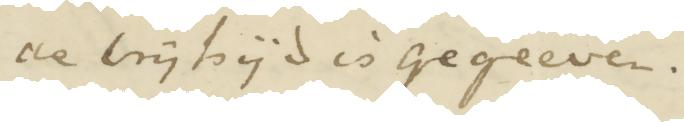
de vrijhijd is gegeeven.
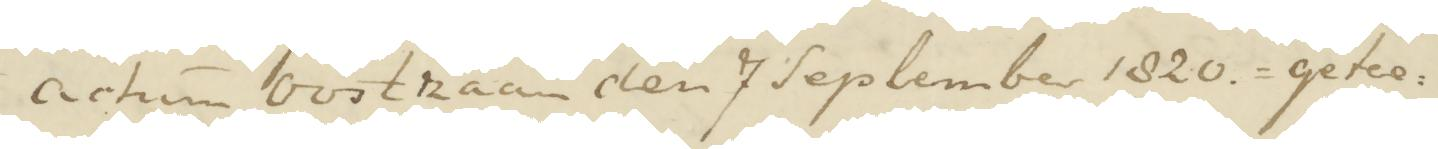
acte in Oostzaan den 7 September 1820. = getee:
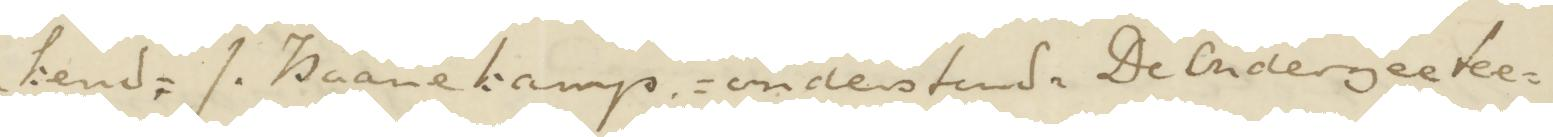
=kend= J. Haanekamp, =onderstond: De Ondergeetee=
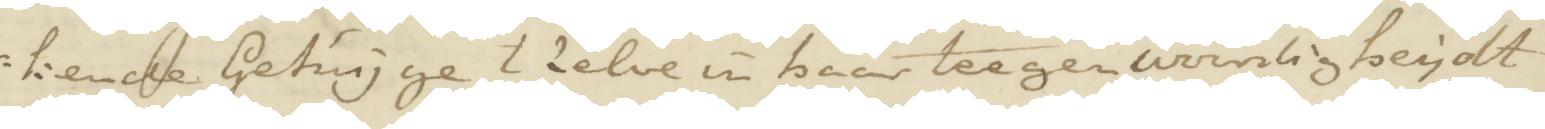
=kende Getuijge t zelve in haar teegenwoordigheijdt
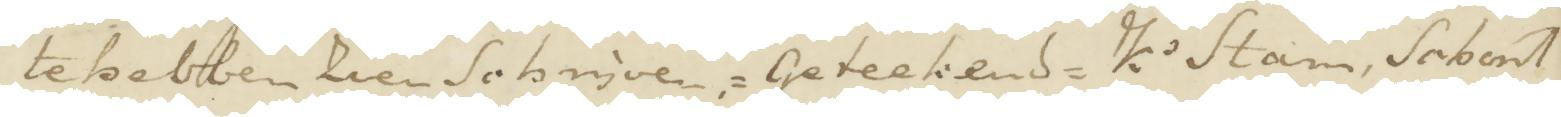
te hebbben zien schrijven,= Geteekend= K Stam, Schout
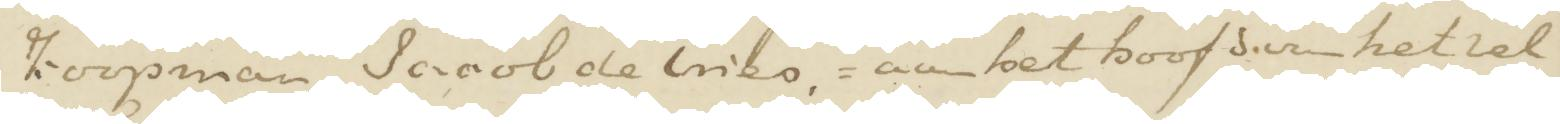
Koopman Iacob de vries, =aan het hoofd van het zel
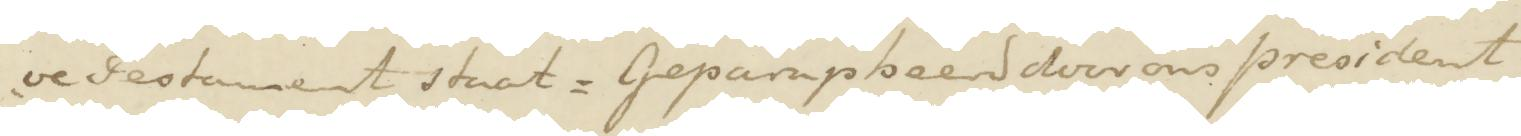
„ve Testament staat = Geparapheerd door ons president
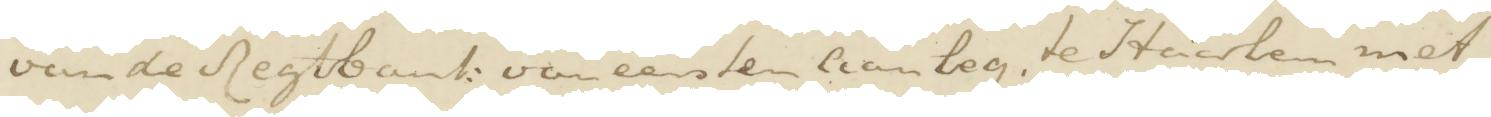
van de Regtbank van eersten aanleg, te Haarlem met
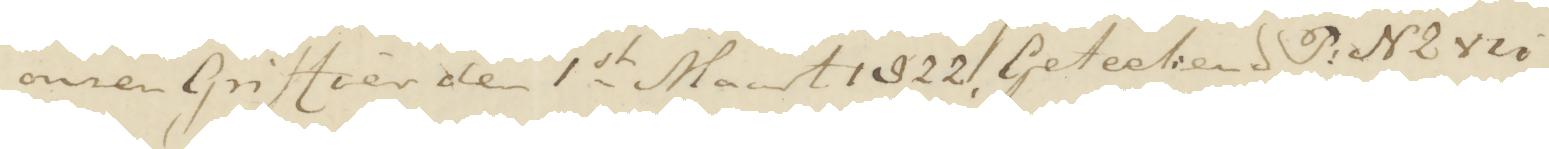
onzen Griffier den 1_st Maart 1822, Geteekend P: N2 v10
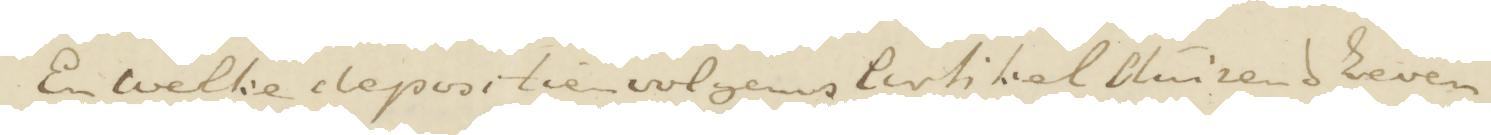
En welke depositien volgens Artikel duizend zeven
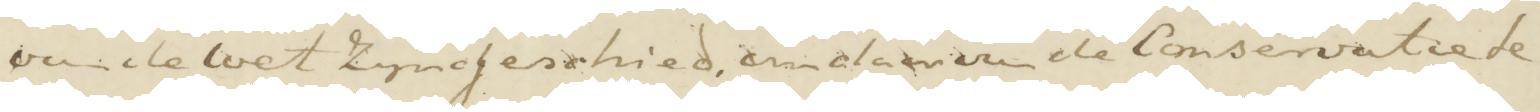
van de wet Zyngeschied, om daarvan de conservatie te
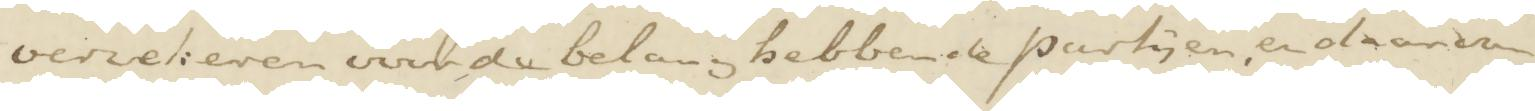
verbeteren voor de belang hebbende partijen, en daar van
